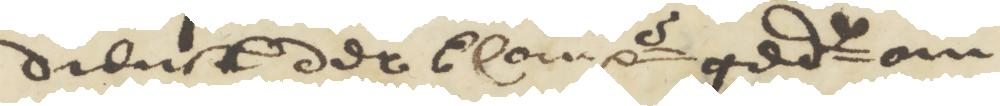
dienst der E Comp=e ged=e om
